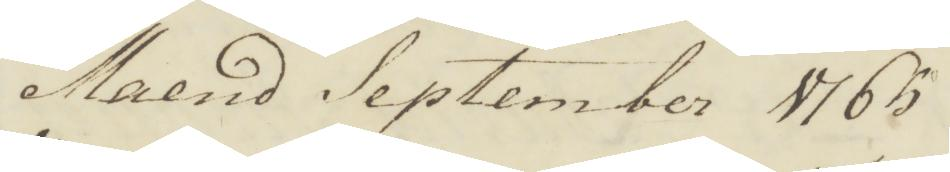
Maand September 1765
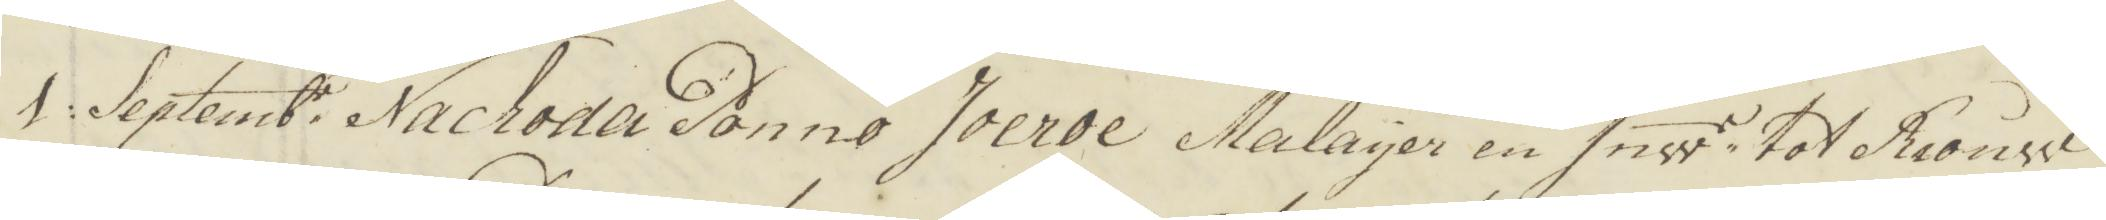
Den 1: Septemb„r Nachoda Ponno Joeroe Malaijer en Jnw„r tot Riouw,
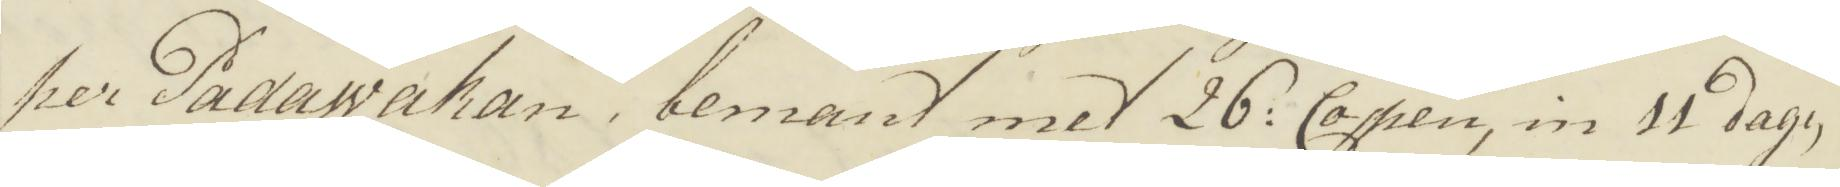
per Padawakan, bemant met 26: Coppen, in 11 dagen
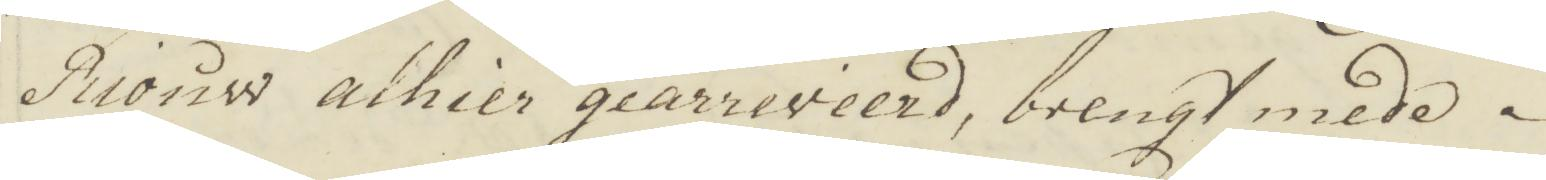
Riouw alhier gearriveerd, brengt mede
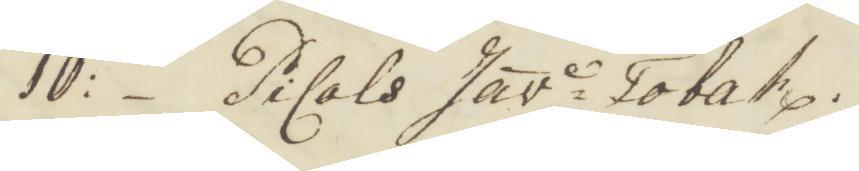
10: — Picols Jav=e Tobak:
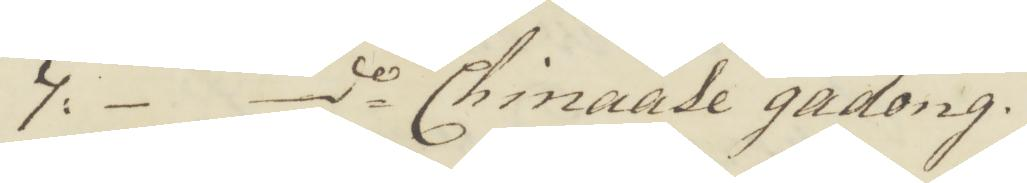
7: — _=o Chinaase gadong.
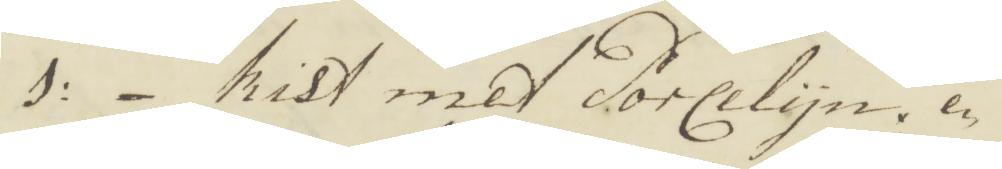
1: — kist met Porcelijn, en
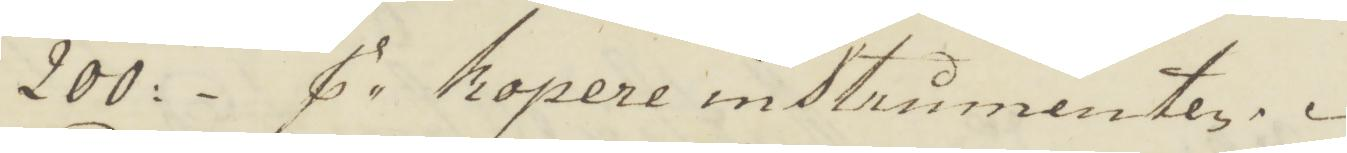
200: – p„s kopere instrumenten.
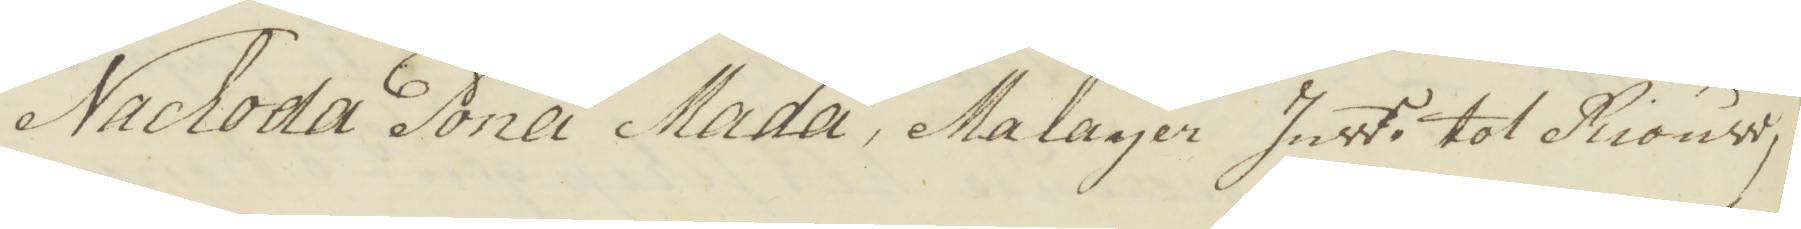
1: _=o Nachoda Pona Mada, Malayer Jnw„r tot Riouw,
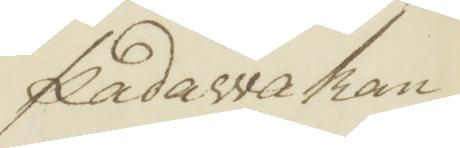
padawakan
